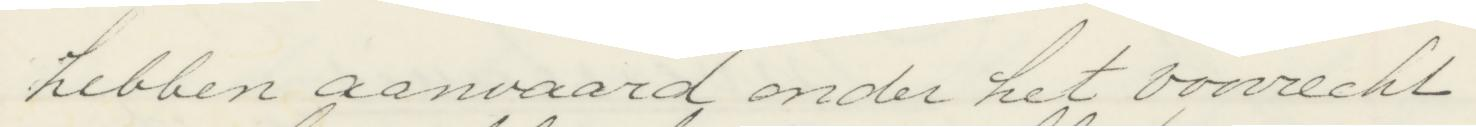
hebben aanvaard, onder het voorrecht
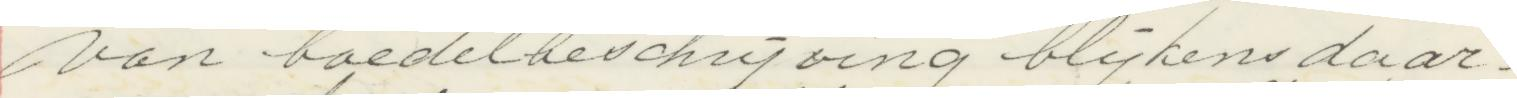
van boedelbeschrijving blijkens daar
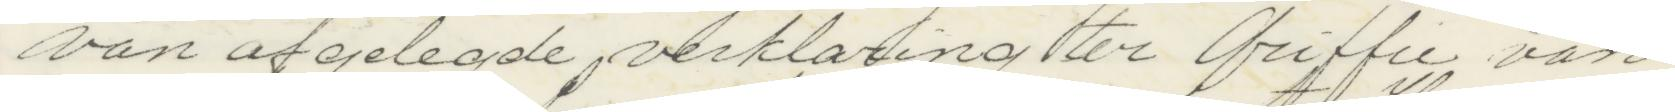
van afgelegde verklaring ter Griffie van
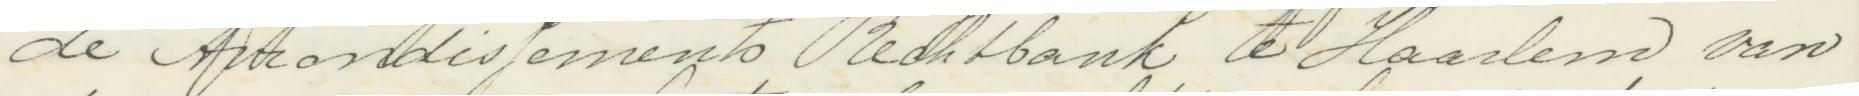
de Arrondissement Rechtbank te Haarlem van
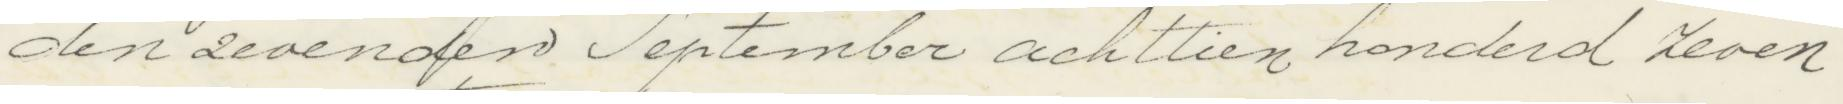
den zevenden September achttien honderd zeven
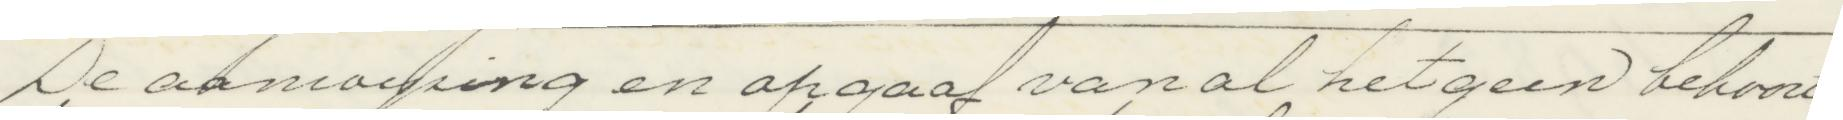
De aanwyzing en opgaaf van al het geen behoort
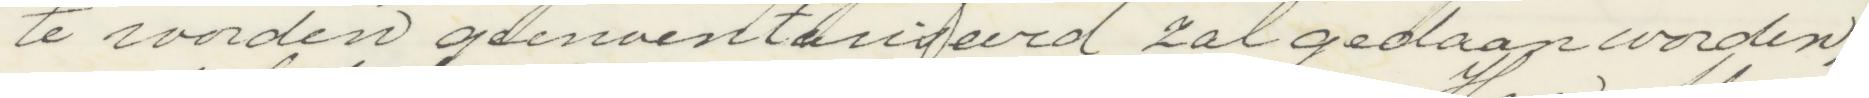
te worden geinventariseerd, zal gedaan worden,
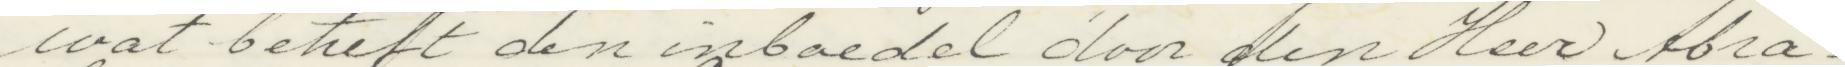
wat beheft den inboedel door den deer Abra
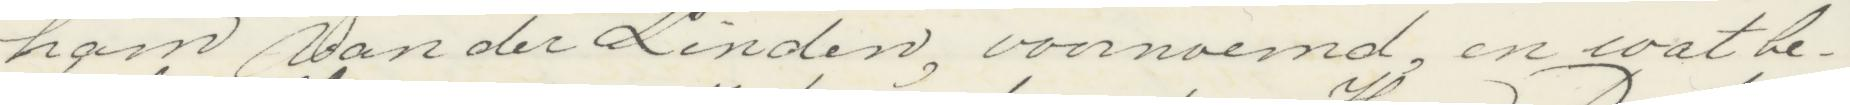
ham van der Linden, voornoemd, en wat be-
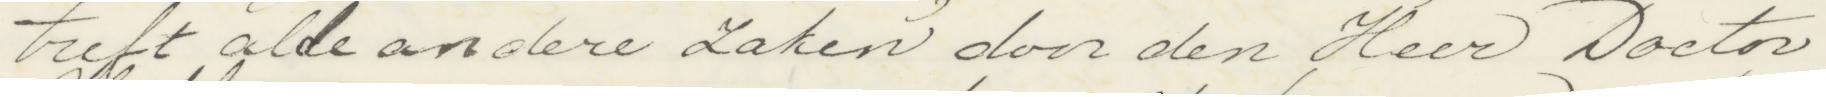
treft al de andere zaken door den Heer Doctor
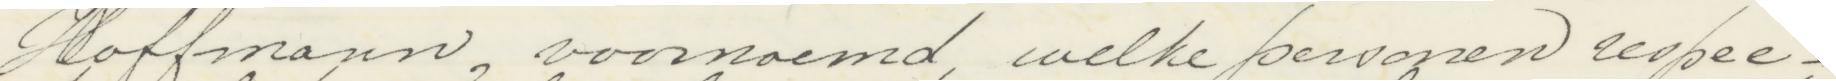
Hoffmann, voornoemd, welke personen respec-
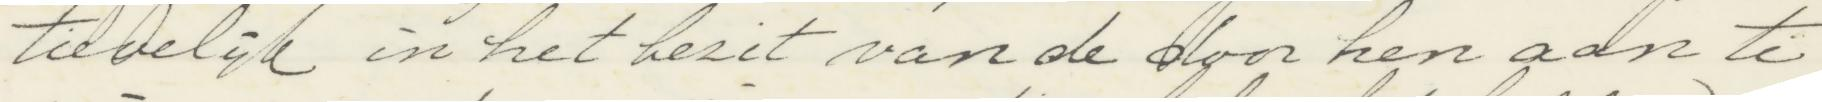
tievelijk in het bezit van de door hen aan te
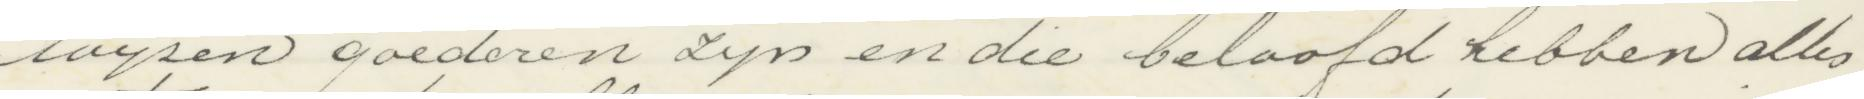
wijzen goederen zijn en die beloofd hebben alles
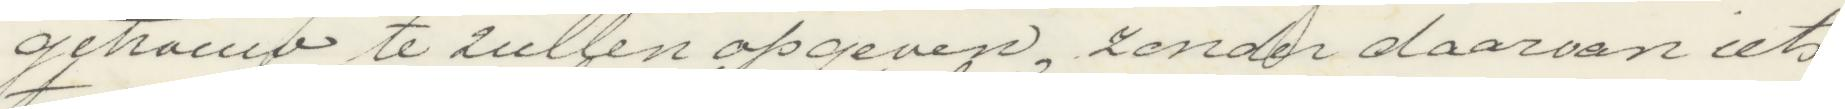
getrouw te zullen opgeven, zonder daarvan iets
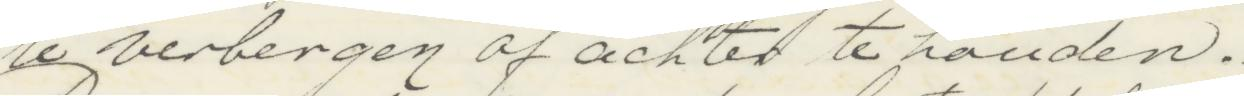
te verbergen of achter te houden.
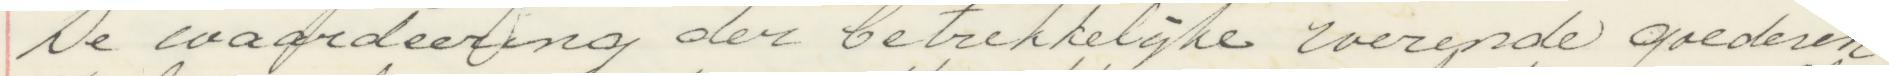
De waardeering der betrekkelijke roerende goederen
